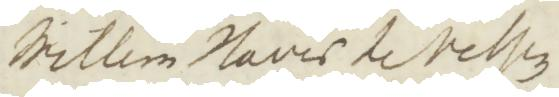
Willem Haver te Velsen
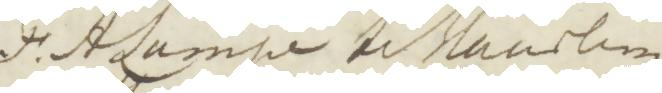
F.A Lampe te Haarlem
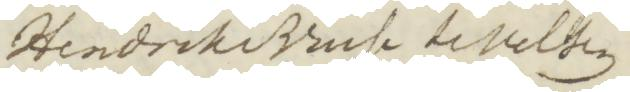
Hendrik Bruse te Velsen
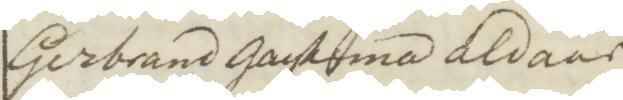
Gerbrand gaykema aldaar
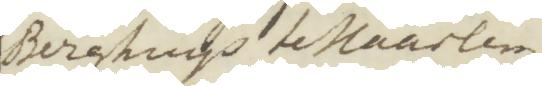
Berghuys te Haarlem
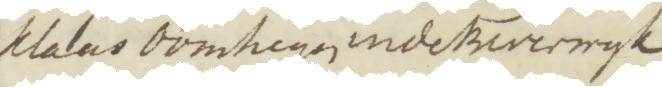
klaas Oomheyn in de Beverwyk
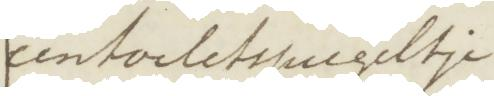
een toiletspiegeltje
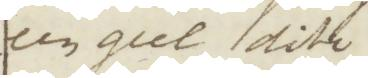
een geel dito
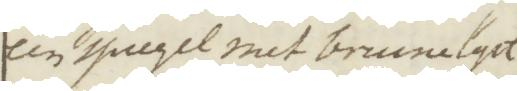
een spiegel met bruine lyst
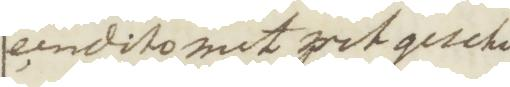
een dito met wet geschil
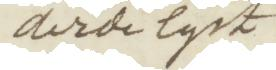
derde lyst
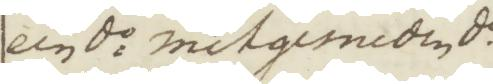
een d:o met gesmeden d.o
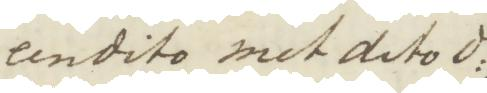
een dito met dito d:o
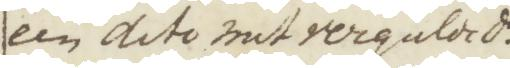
een dito met vergulde d.o
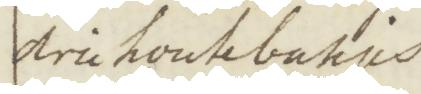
drie houte bakjes
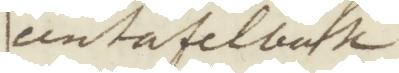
een tafelbak
